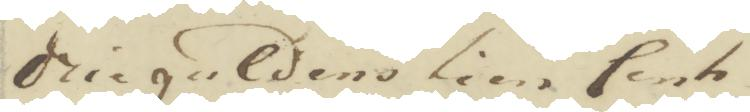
drie guldens tien Cents
